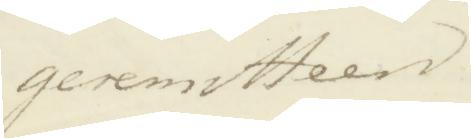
geremitteerd
